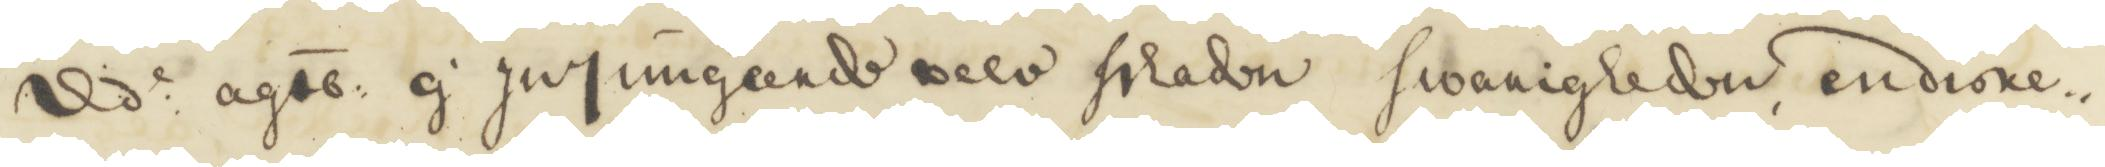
Ed:e agtb: g’ jnsungeerde vele schaden, swarigheden, en disre„
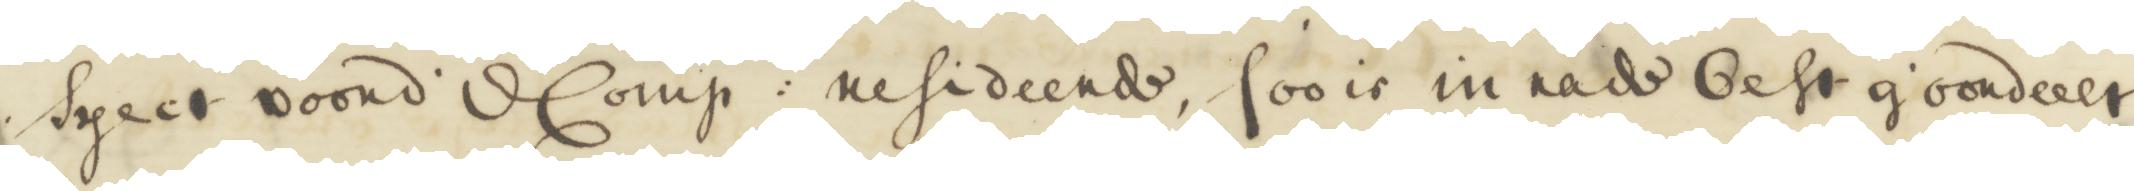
spect voord’ E Comp: resideerde, soo is in rade best g’oordeelt
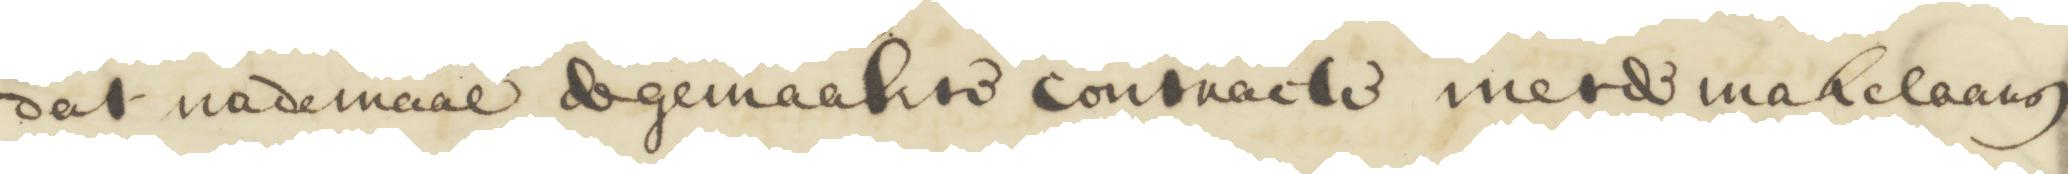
dat nademaal degemaakte contracte metde makelaars
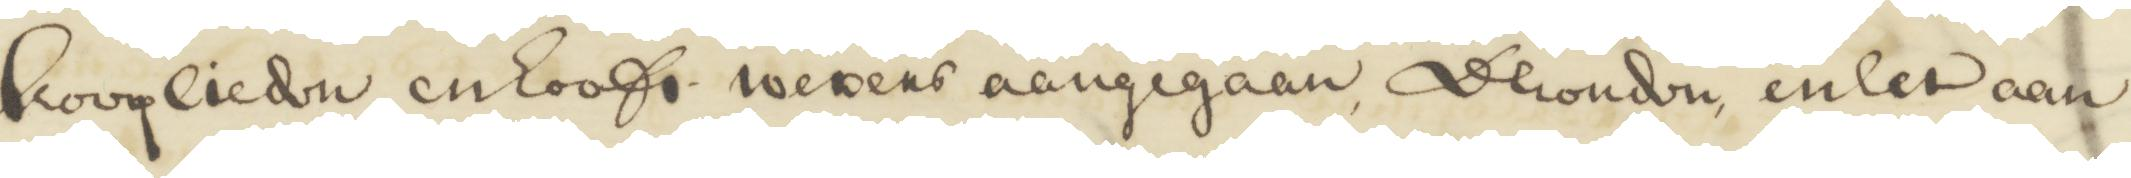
kooplieden, en hooft wevers aangegaan, tehouden, enhet aan
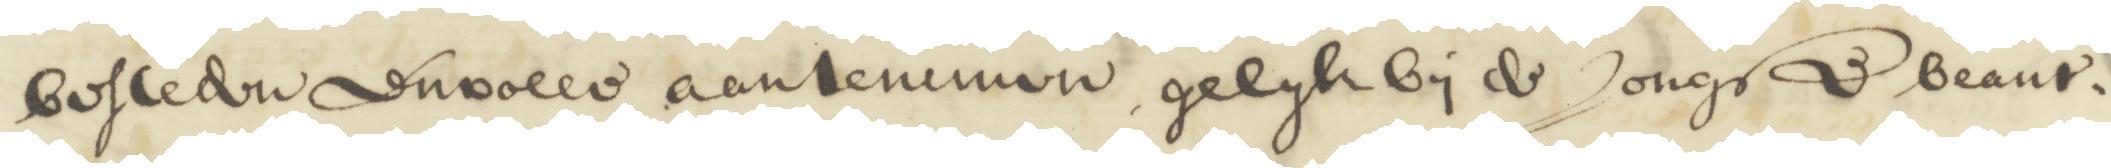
besteden ten volle aantenemen, gelijk bij de jongste beant„
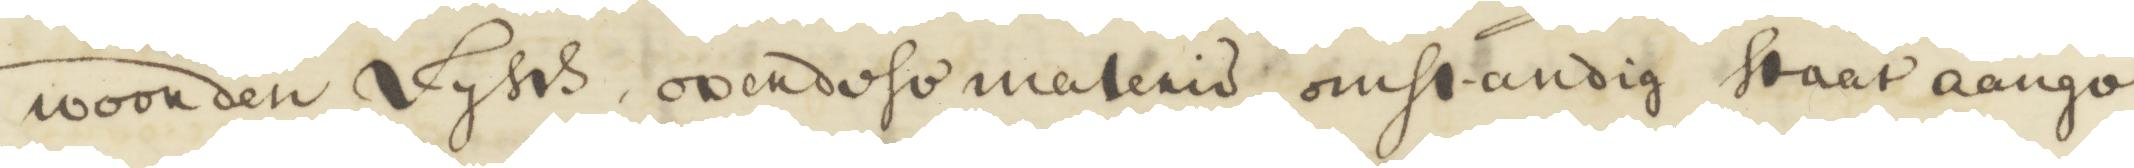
woorden Eysch, overdese materie, omstandig staat aange
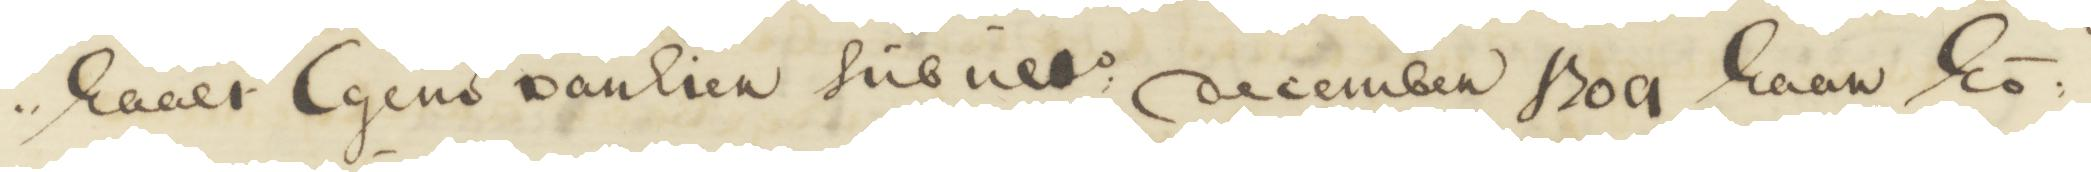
„haalt 't gene van hier sub ult:o december 1704 haar ho:
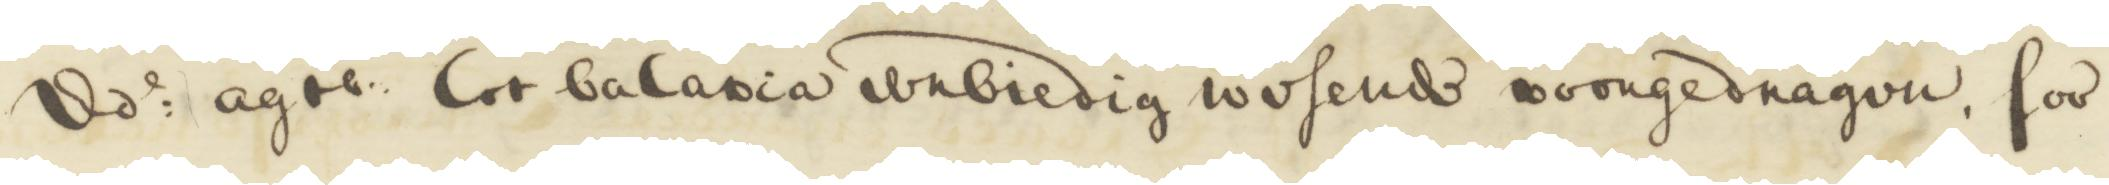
Ed:e agtb: tot batavia eerbiedig wesende voorgedragen, soo
